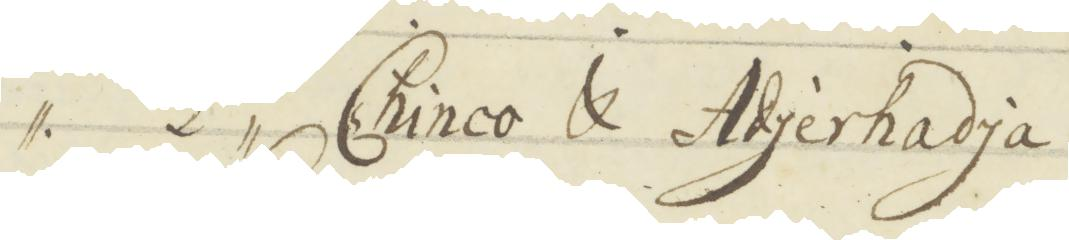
„ P„lo Chinco & Adjerhadja
